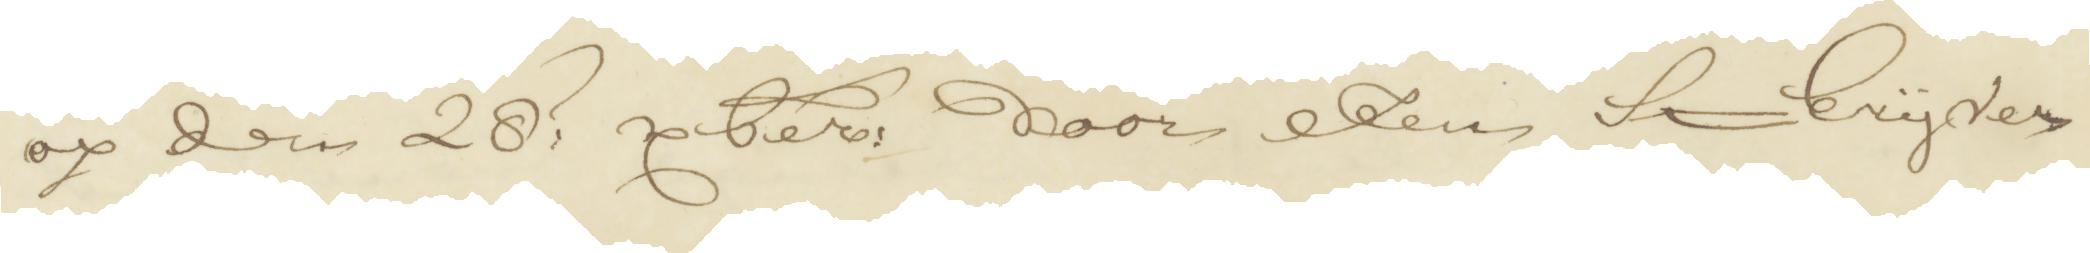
op den 28:' xber: door Een schrijver
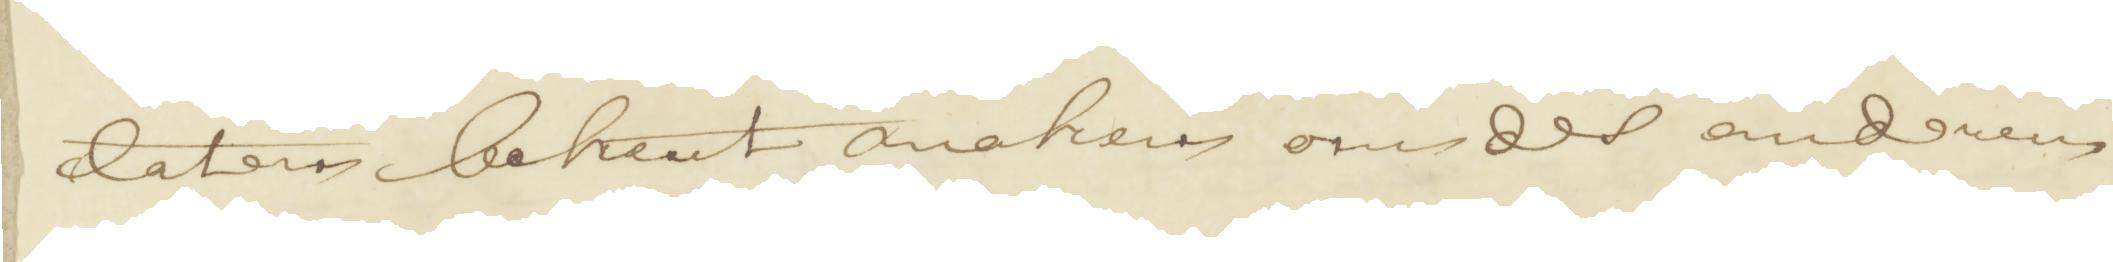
laten bekent maken om des anderen
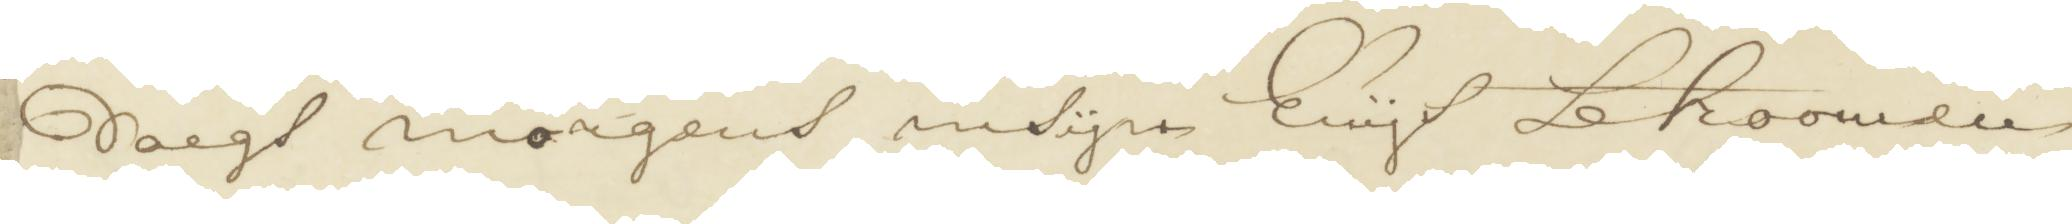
daegs morgens in sijn huijs te koomen
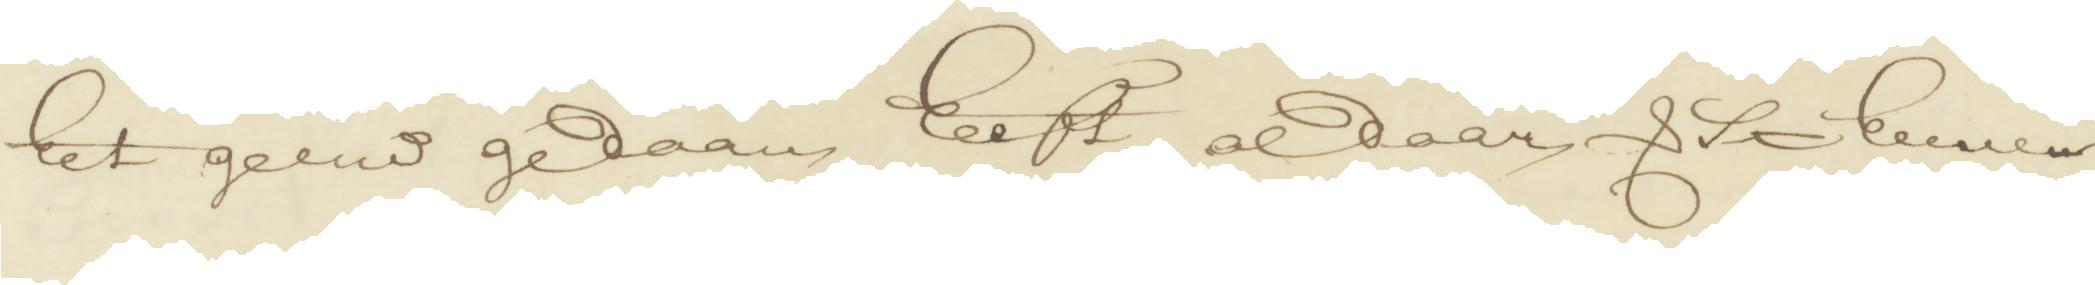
het geene gedaan heeft aldaar verscheenen
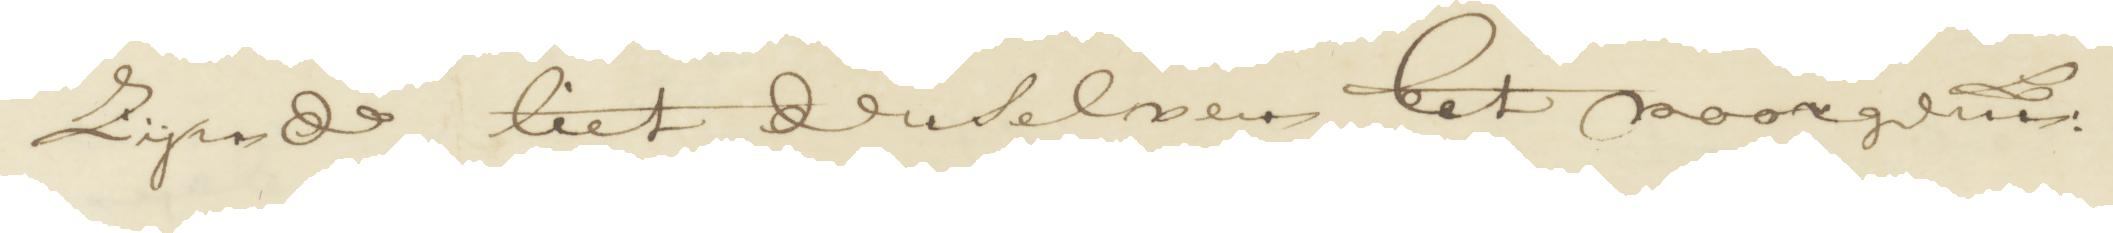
zijnde, liet denselven het voorgem:
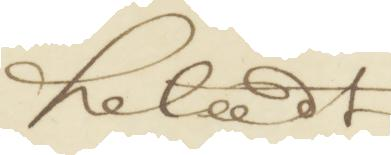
kleedt
